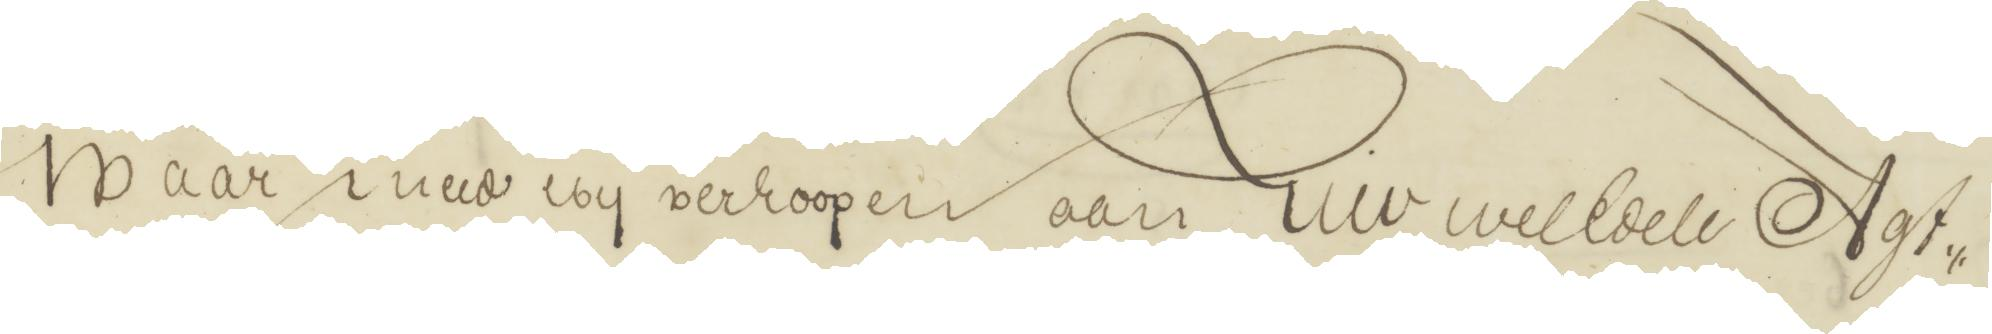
waar meed wy verhoopen aan uw wel Edele Agt„
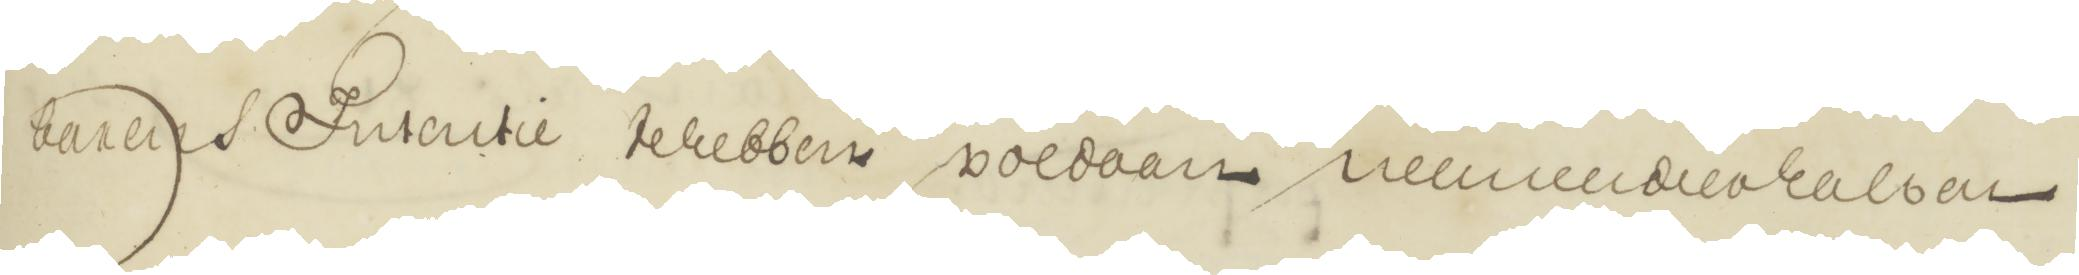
barens Intentie tehebben voldaan neemen dierhalven
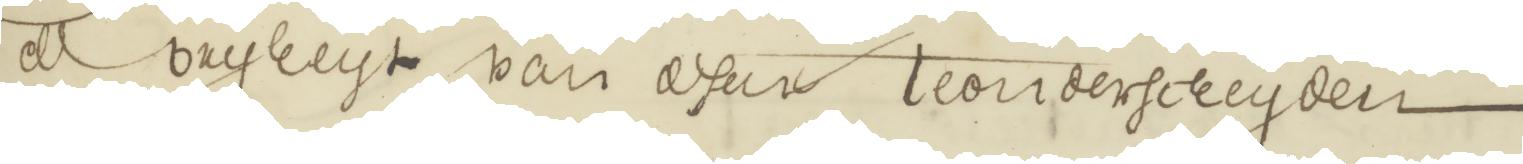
de vryheijt van deseer te onderscheyden
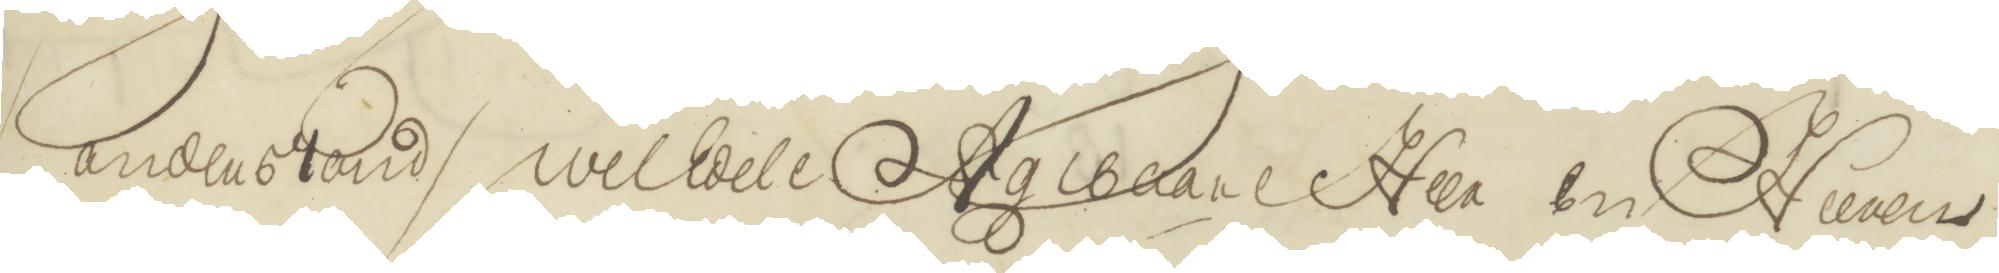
/ onder stond / wel Edele Agtbaare Heer en Heerens
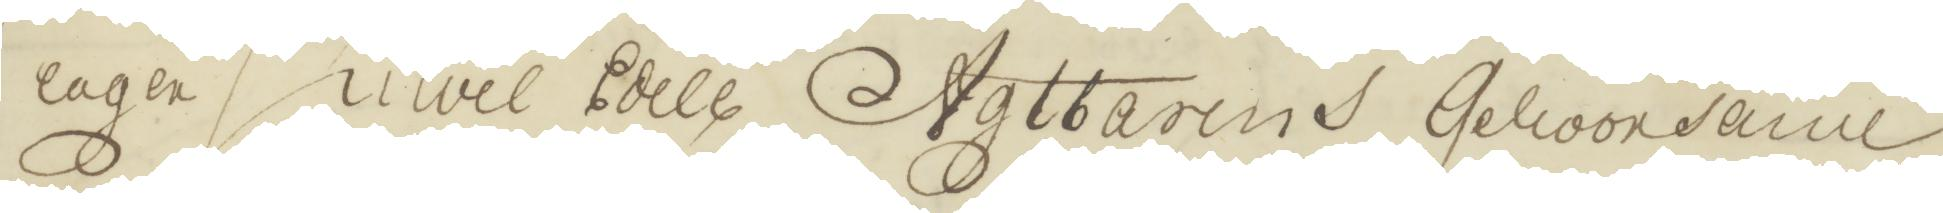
/ lager/ uwel Edele Agtbarens Gehoorsame
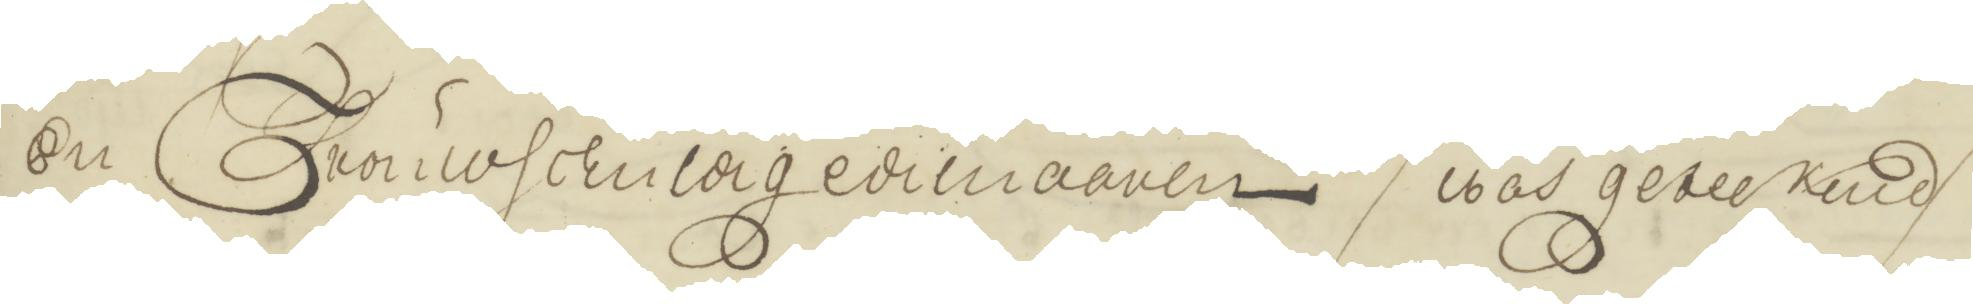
en Trouwschuldige dienaaren / was geteekend/
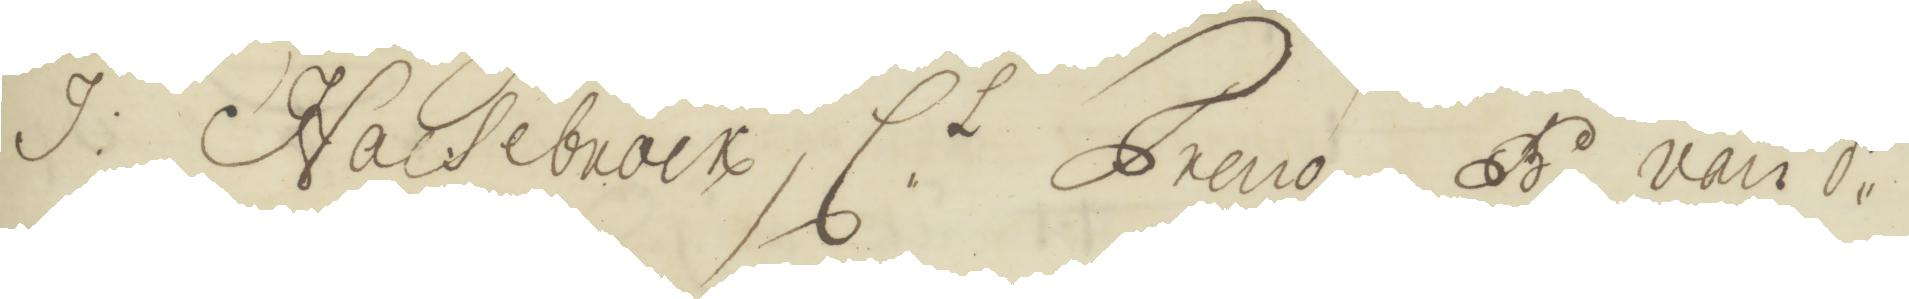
I: Haesebroek, C„l Treno, B„ van d„r
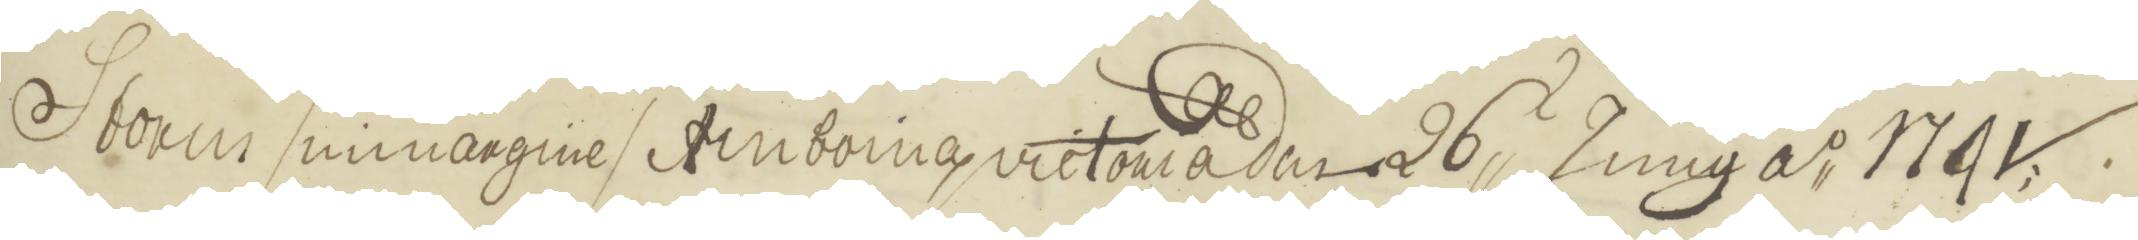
Storm /in margine/ Amboina victoria den 26„' Junij a„o 1741:
